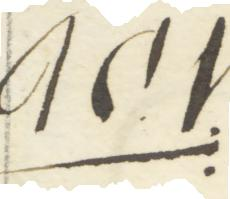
451:
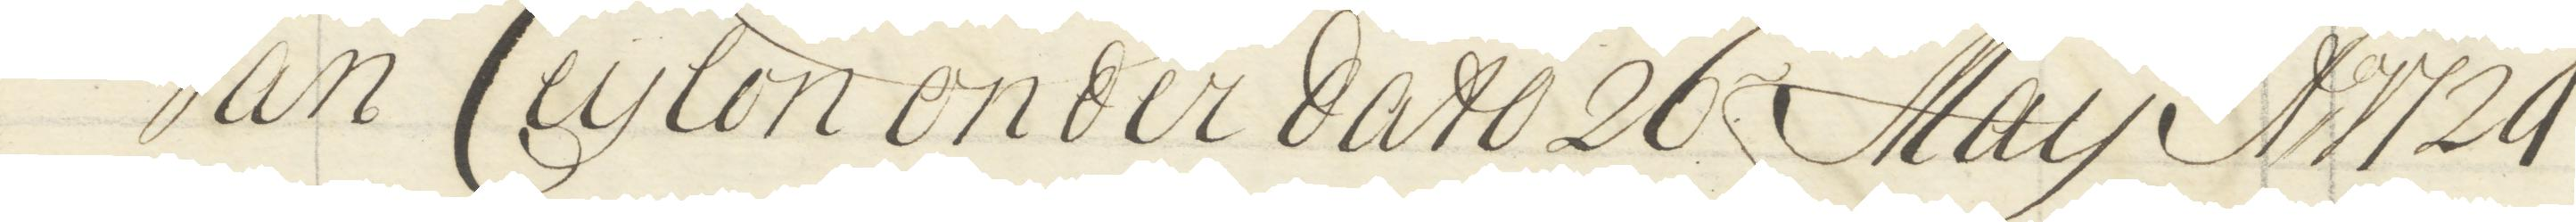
Van Ceijlon onder dato 26:~ May A„o 1724
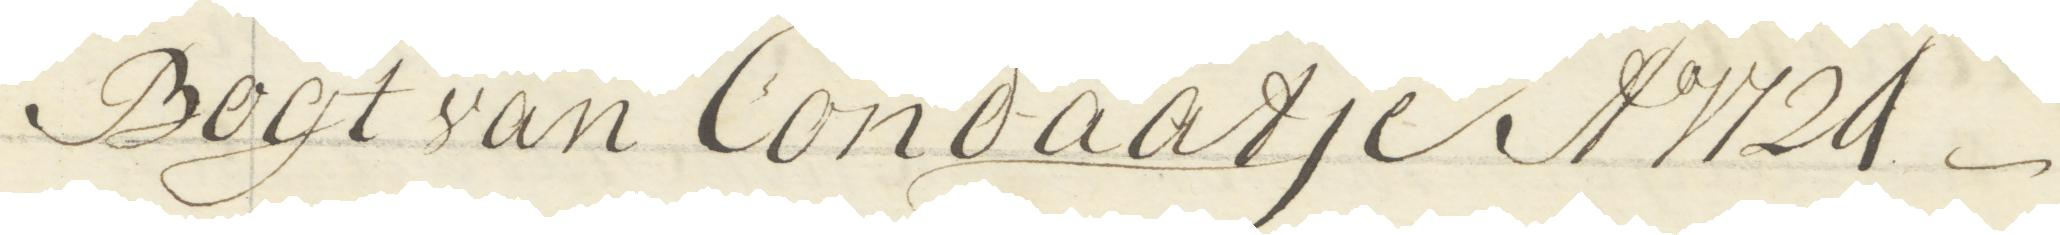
Bogt van Condaatje Ao 1724 ~
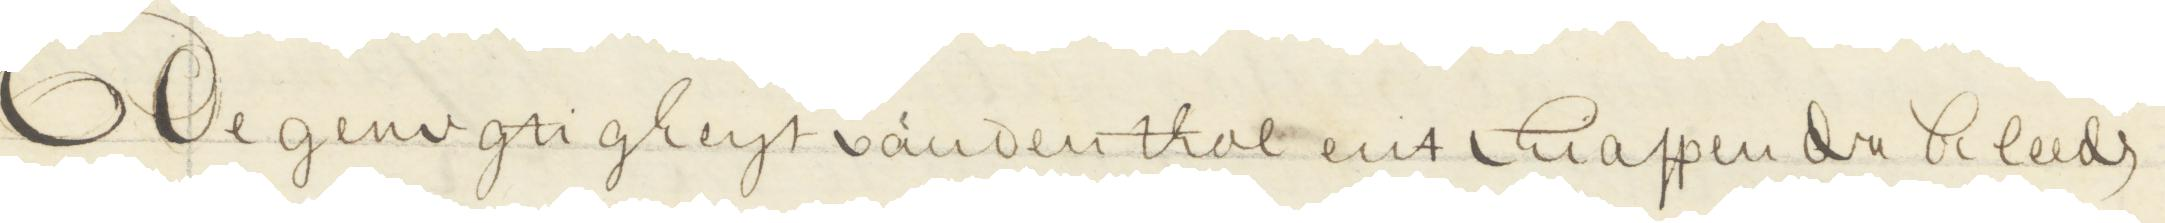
De geregtigheijt van den thol en’t chiappen der beleeden
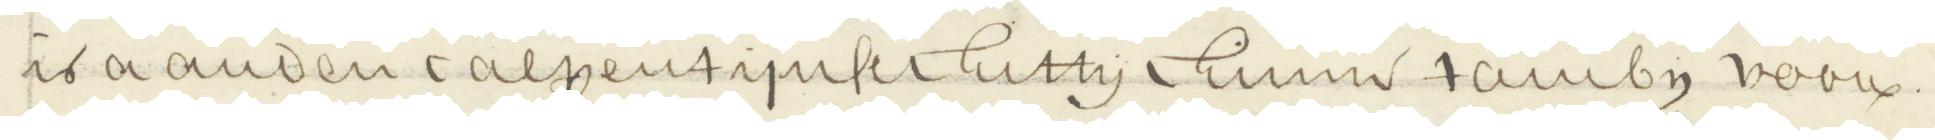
is aanden calpentijnse chittij chinne tambij voor.
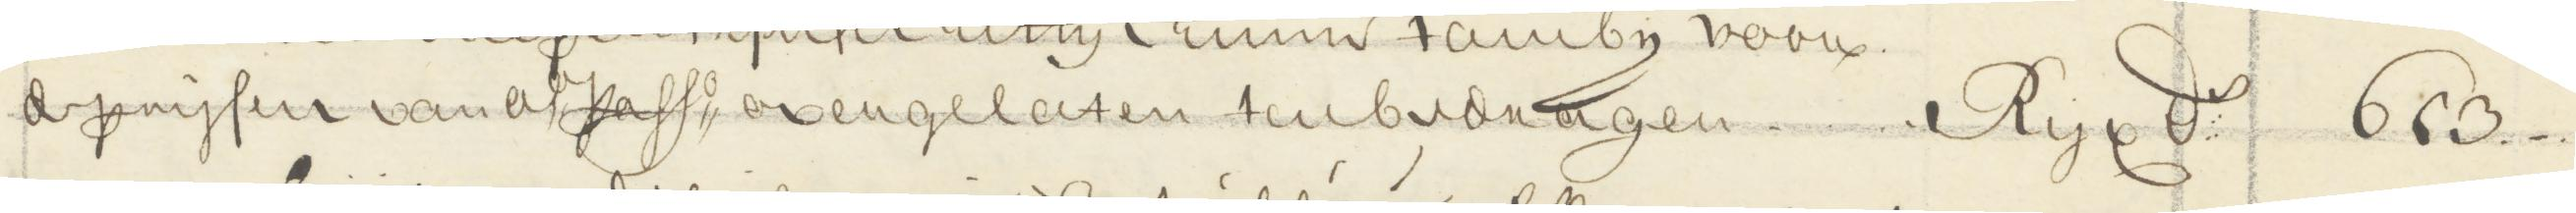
de prijsen van a„o pass„o overgelaten ten bedragen....Rijxd:s 653.-.
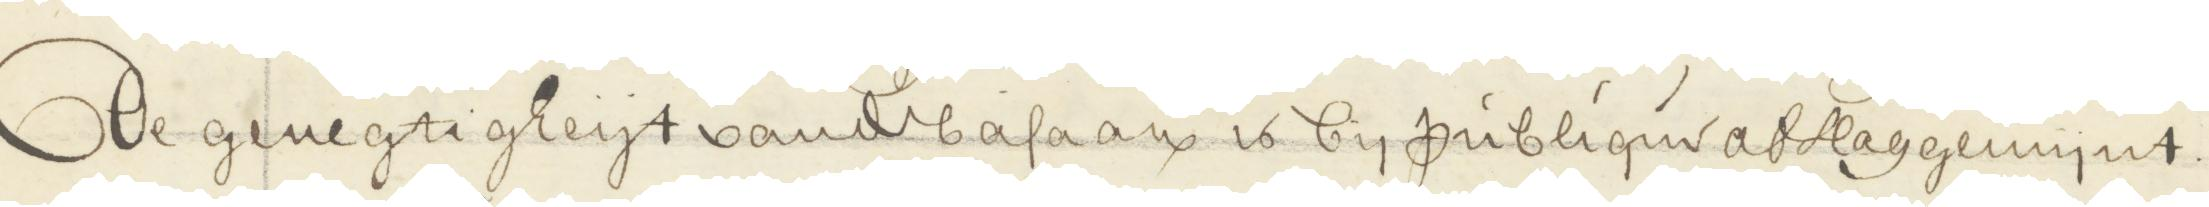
De geregtigheijt van de basaar is bij publique afslag gemijnt.
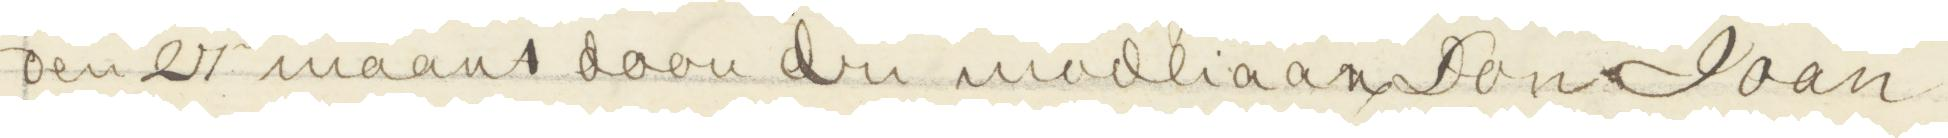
den 27~ maart door den modliaar Don Ioan
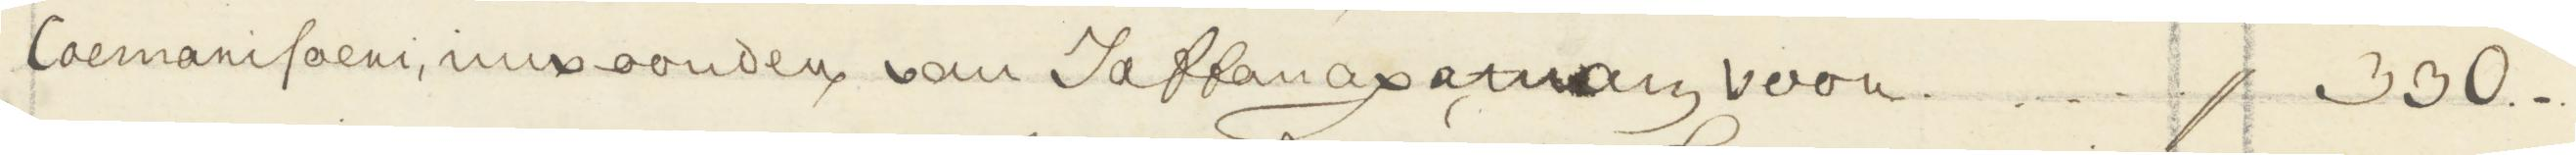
Coemarisoeri, inwoonder van Iaffanapatnam voor . . - - .„ 330.-.
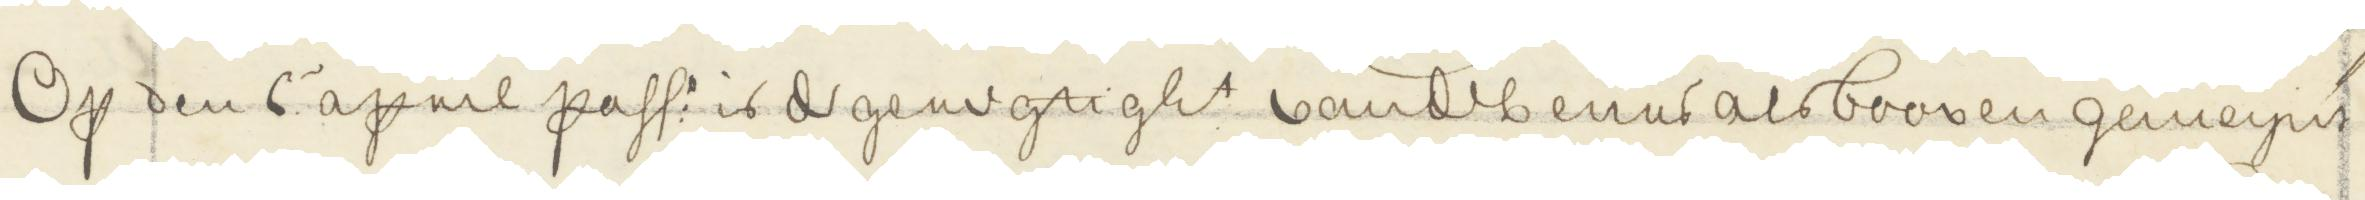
Op den 6.~ april pass:o is de geregtigh:t van de beurs als booven gemeijnt
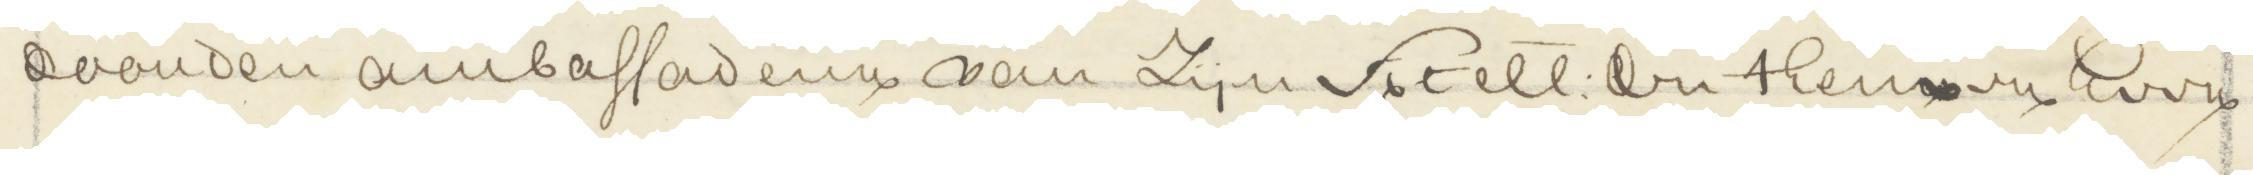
door den ambassadeur van zijn Excell: den theuver heer
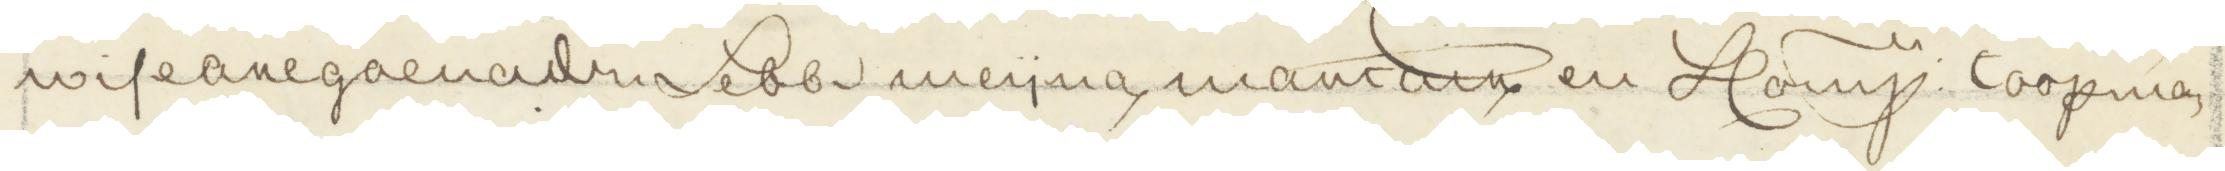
wiseanegoena den Lebbe meijna, marcair en sComp: Coopman
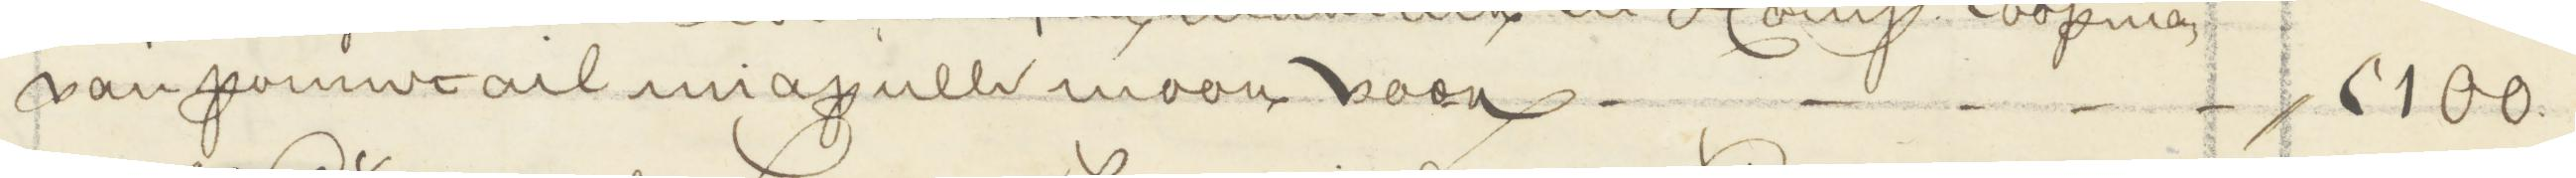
van ponnecail miapulle moor voor - - - - - „ 5100.
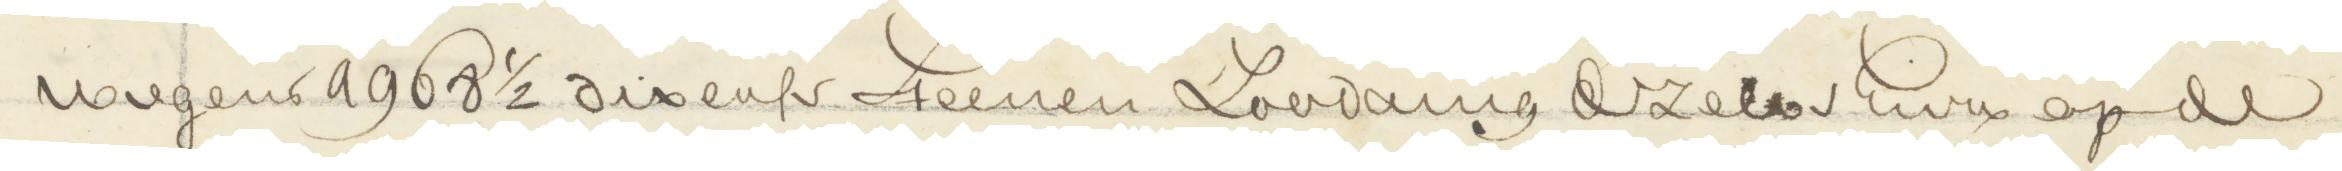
wegens 4968½ diverse steenen zoodanig dezelve hier op de
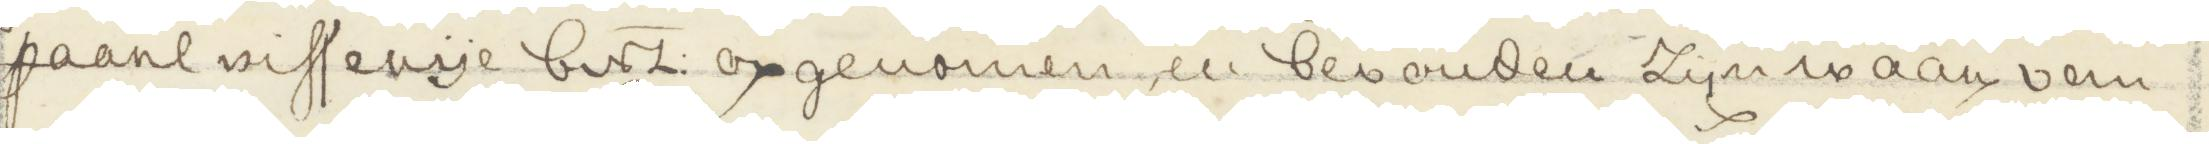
paarl visserije best: op genomen en bevonden zijn waar van
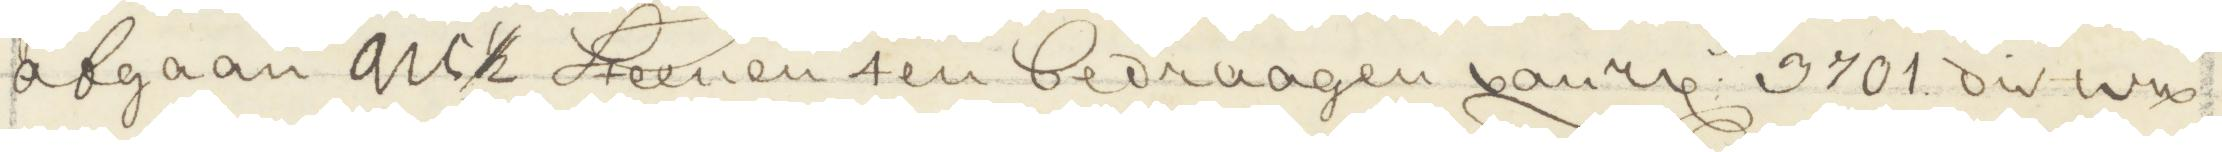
afgaan 415½ steenen ten bedraagen van rx:s 3701. die ter
